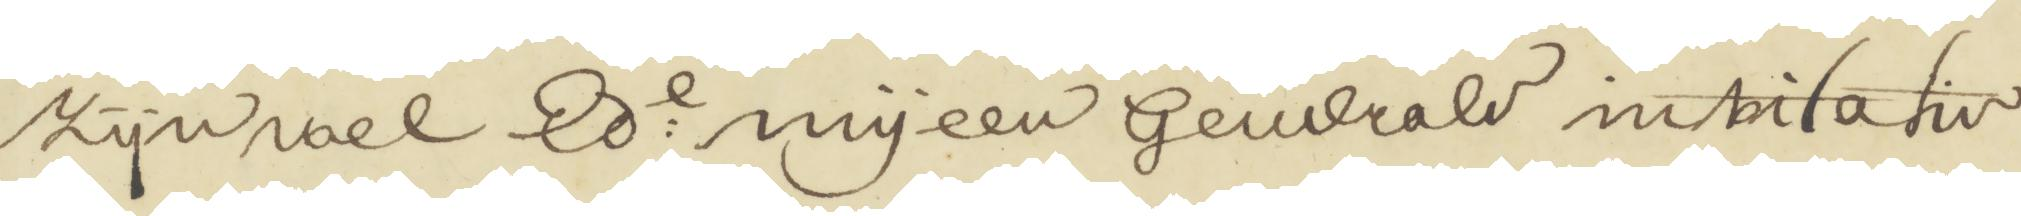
zijn wel Ed:e mij een Generale invitatie
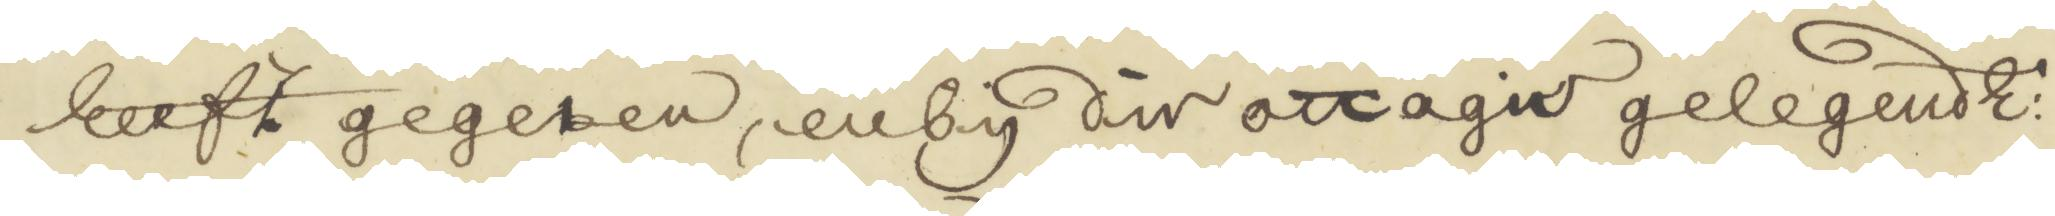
heeft gegeven, en bij die occagie gelegendh:t
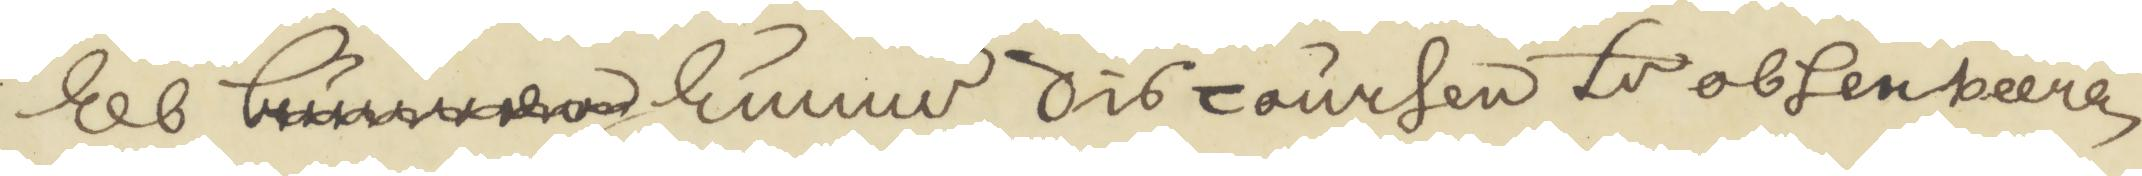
heb kunnen hunne discoursen te observeeren
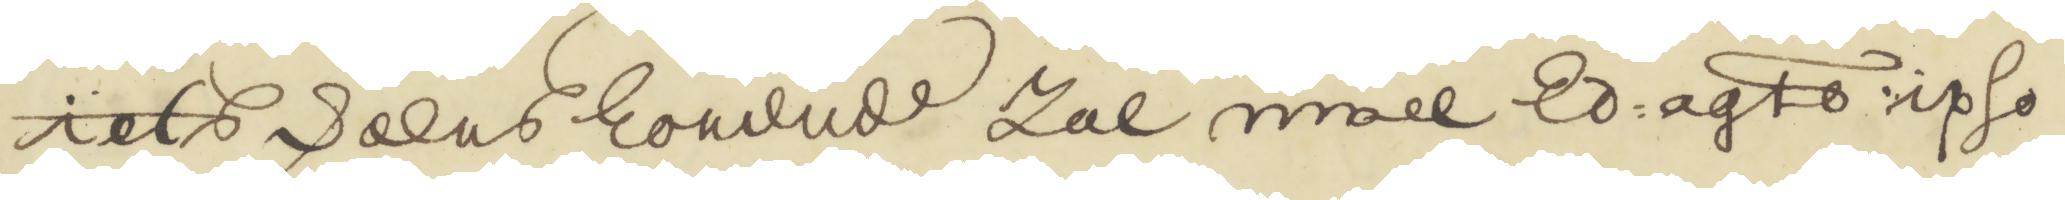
iets verders horende zal uwel Ed: agtb: ipso
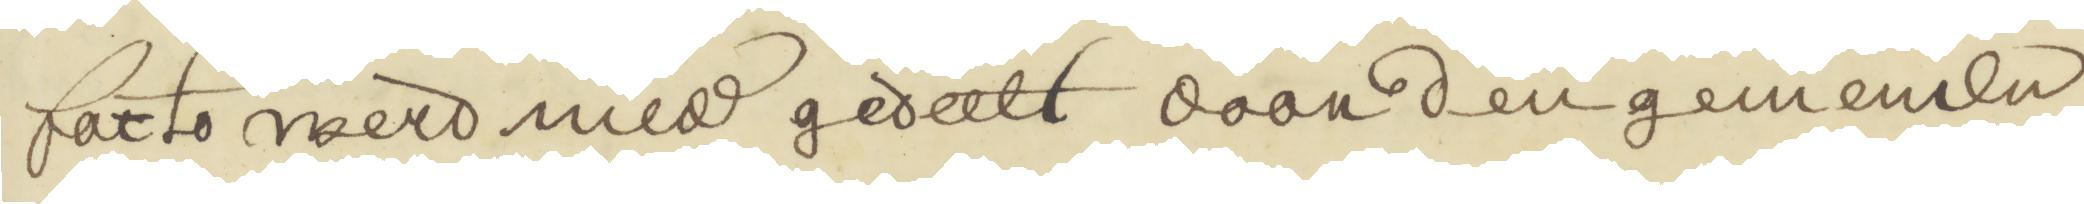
facto werd mede gedeelt door den gemenen
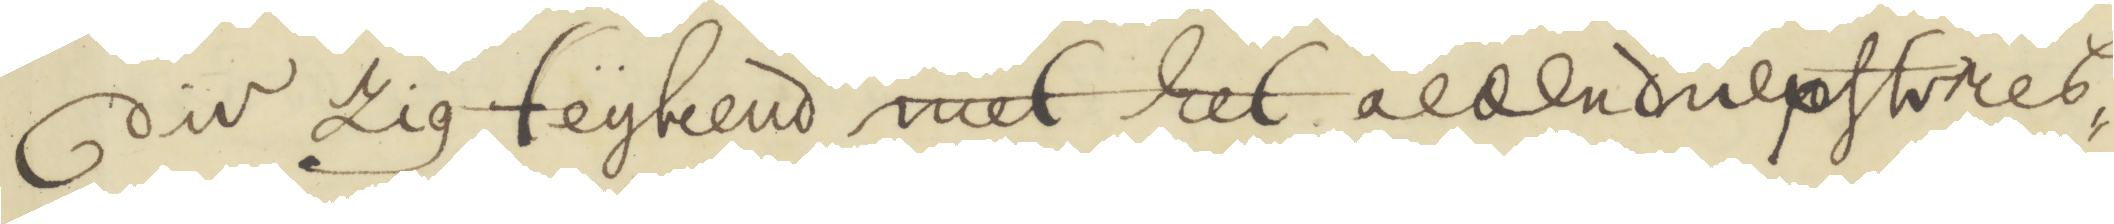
die zig teijkend met het alderdiepste res„
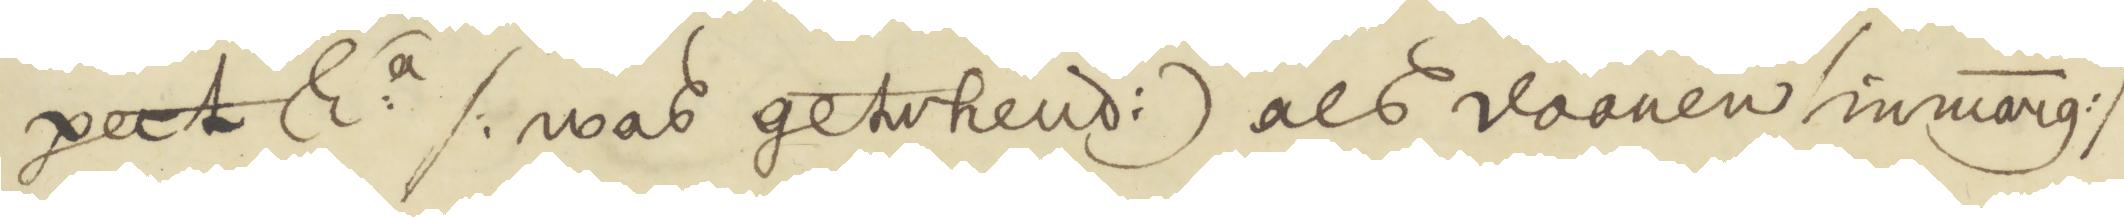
pect Et:a /: was getekend:) als vooren (in marg:/
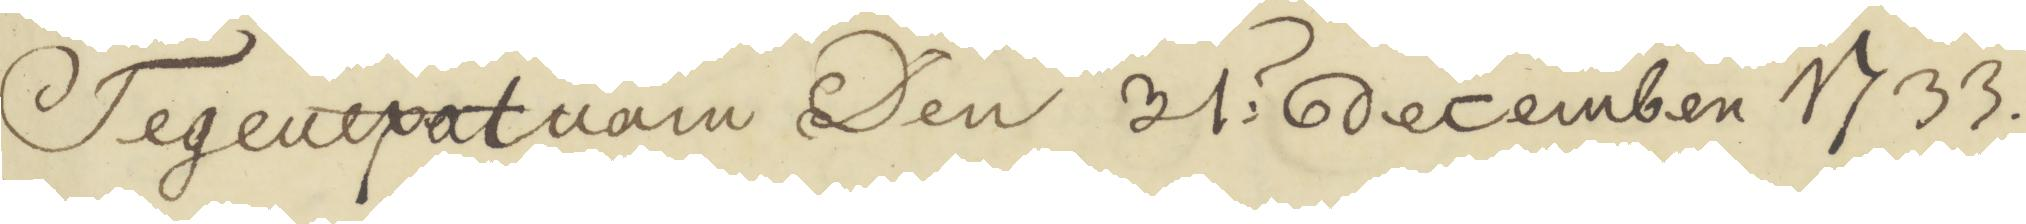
Tegenepatnam Den 31:' december 1733.
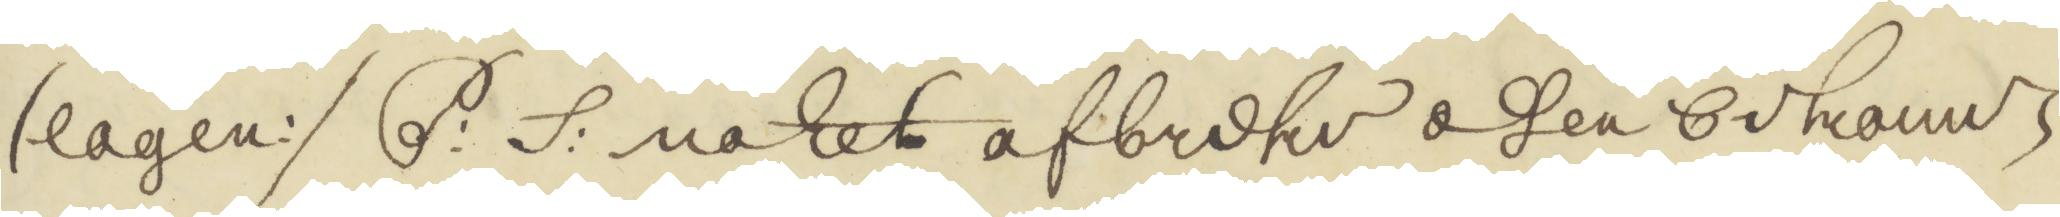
(lager:) P: s: na het afbreke deser bekomen
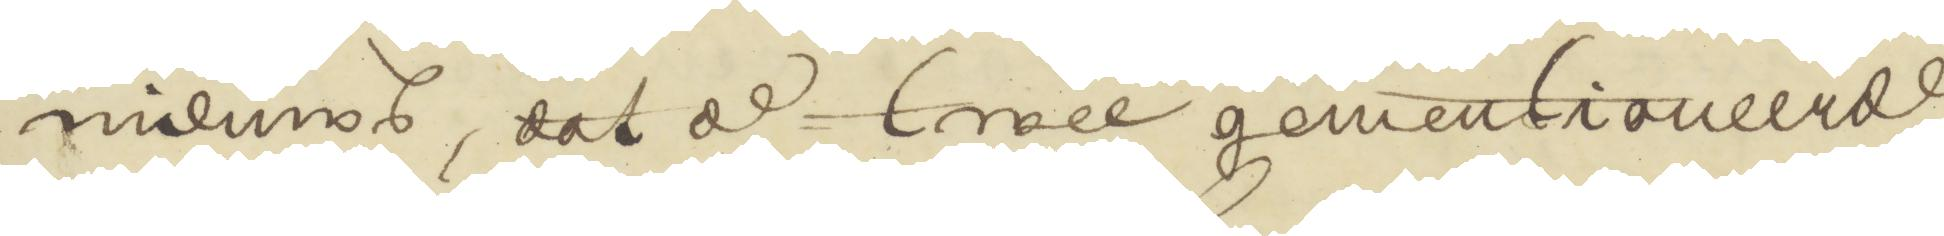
nieuws, dat de twee gementioneerde
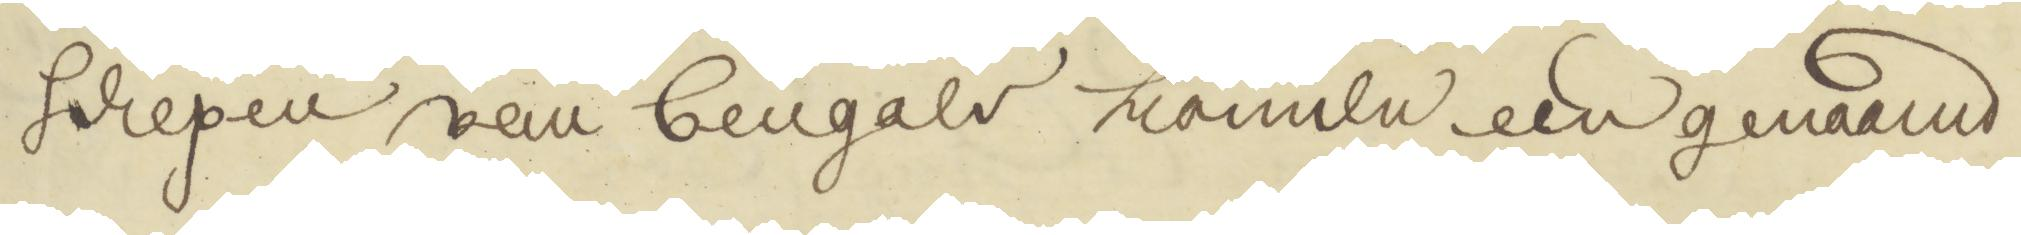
schepen van bengale komen een genaamd
